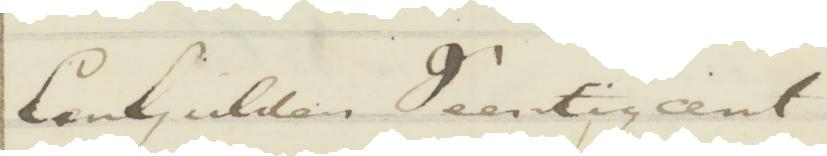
EenGulden Veertig cent
